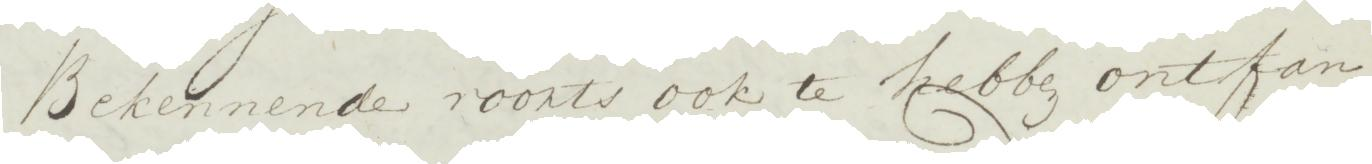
Bekennende voorts ook te hebben ontfan
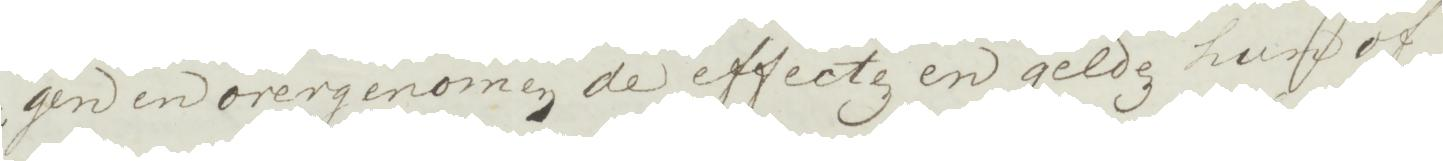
gen en overgenomen de effecten en gelden hun of
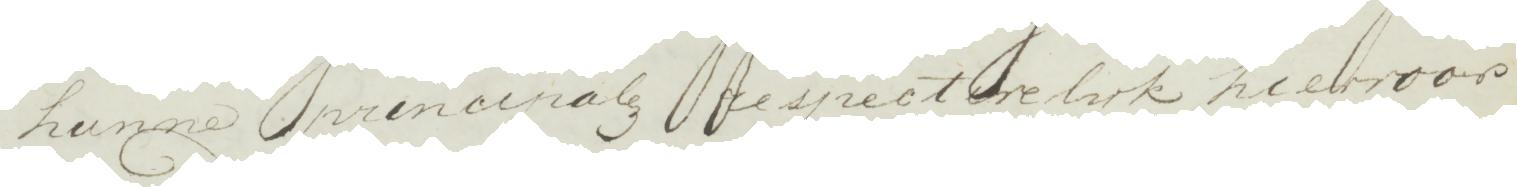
hunne principalen respectievelyk hiervoor
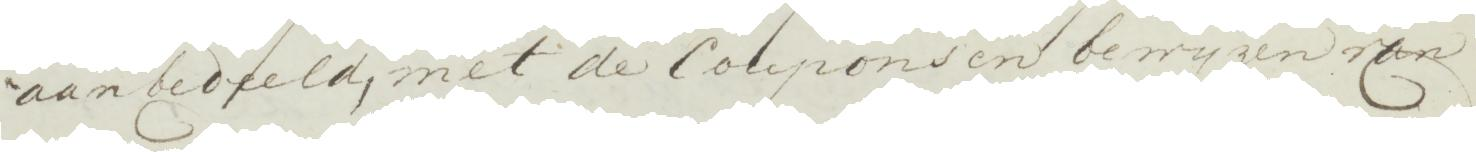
aan bedeeld, met de Coupons en bewyzen van
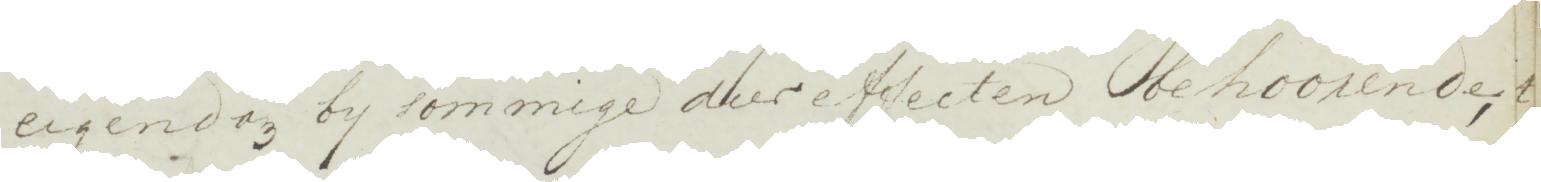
eigendom by sommige dier effecten behoorende,
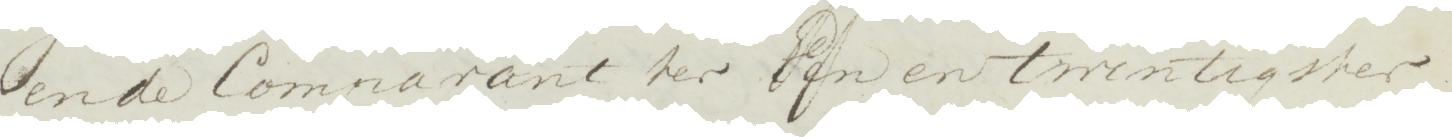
en de Comparant ter Een en twintigsten
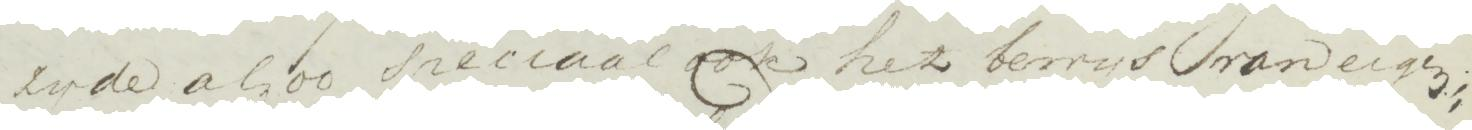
zyde alzoo speciaal ook het bewys van eigen=
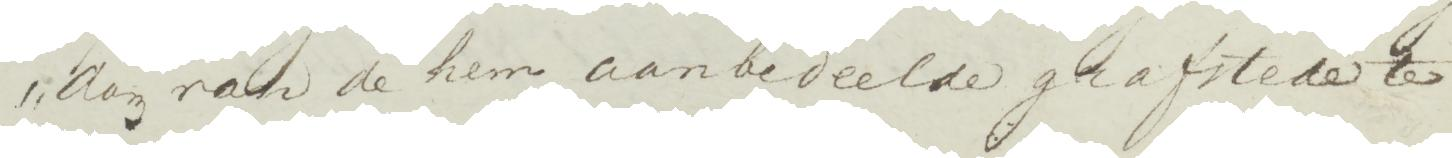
„dom van de hem aanbedeelde grafstede te
